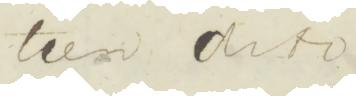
tien dito
